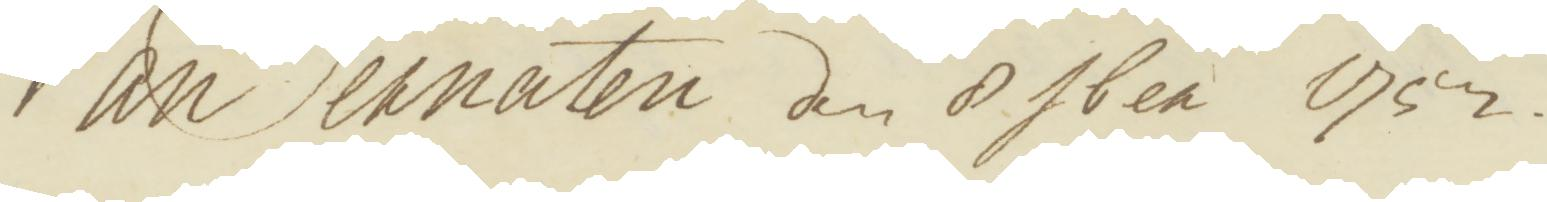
Van Ternaten den 8 7ber 1752
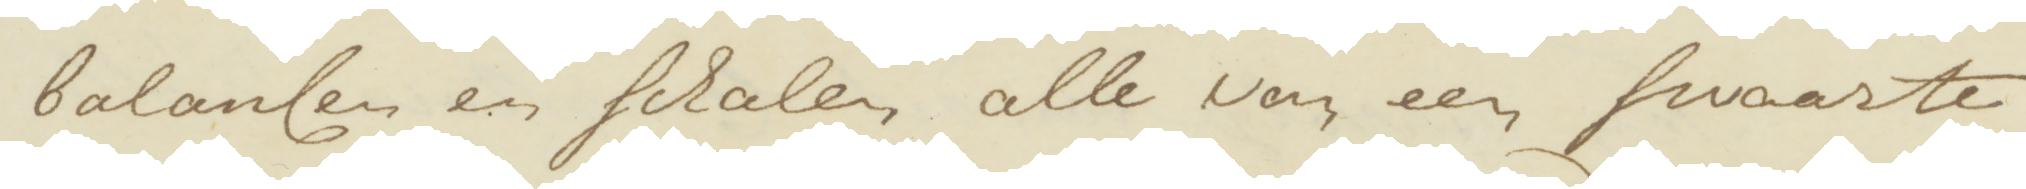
balancen en schalen alle van een swaarte
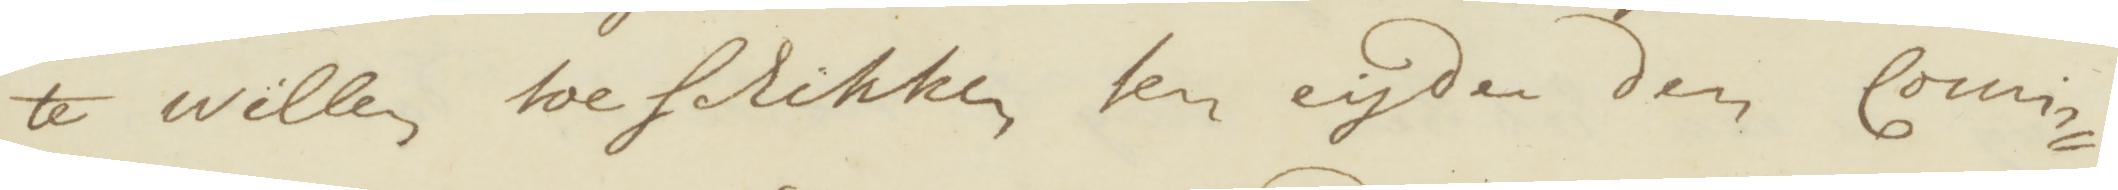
te willen toe schikken ten eijden den Conin„
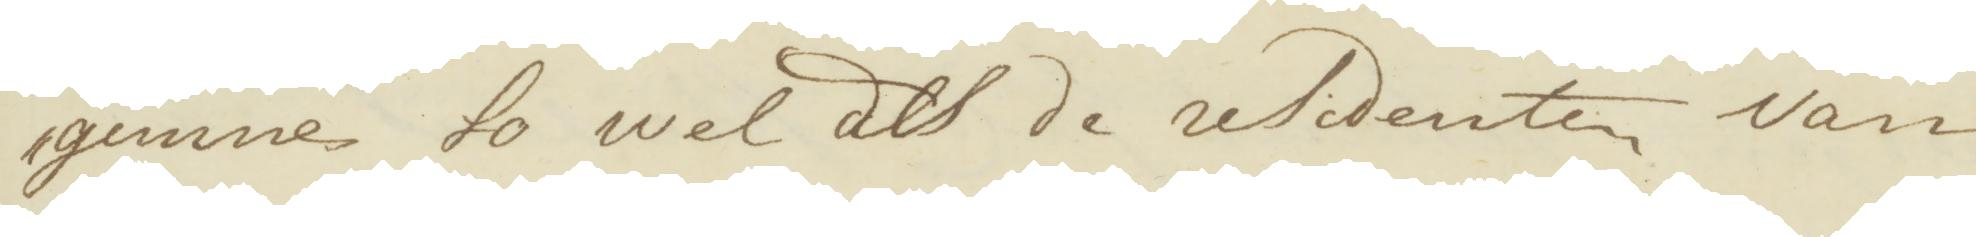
„ginne so wel als de residenten van
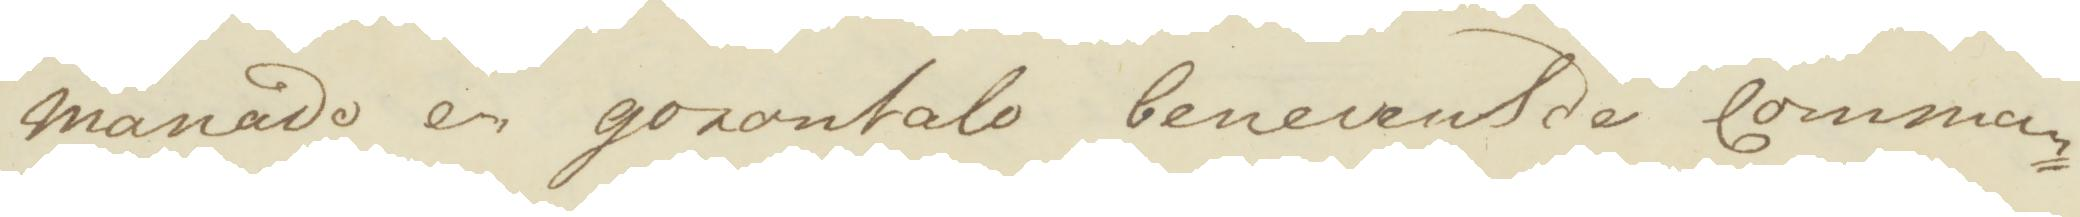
manado en gorontalo benevens de Comman=
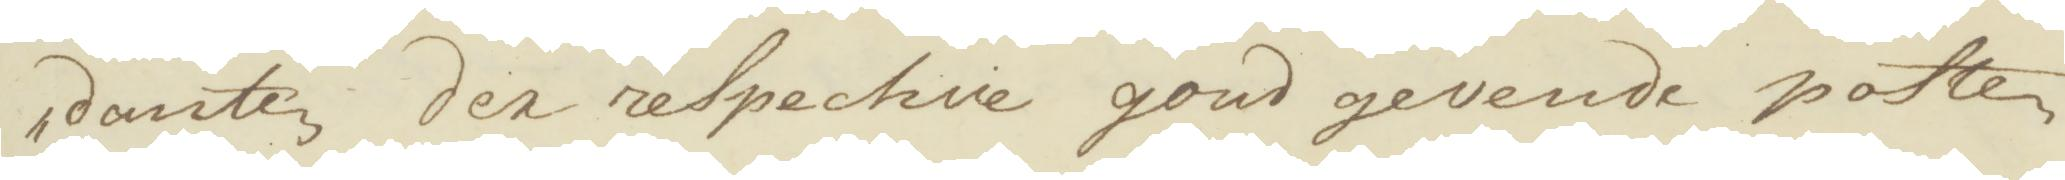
„danten der respective goud gevende posten
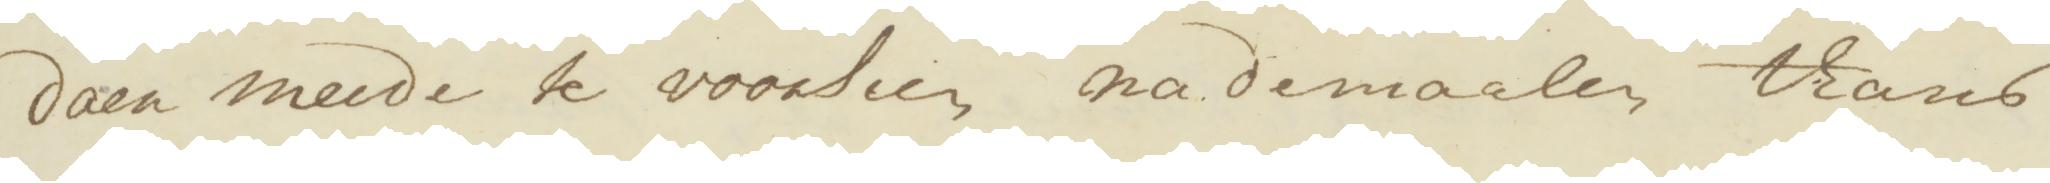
daer meede te voorsien na demaalen thans
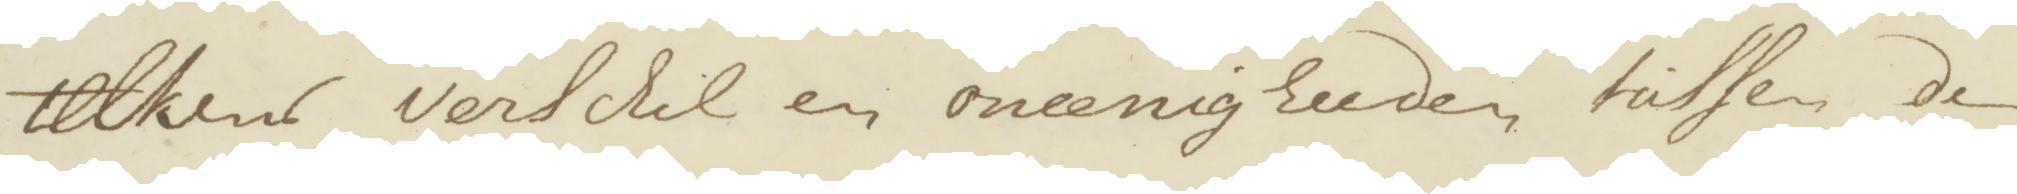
telkens verschil en oneenigheeden tussen de
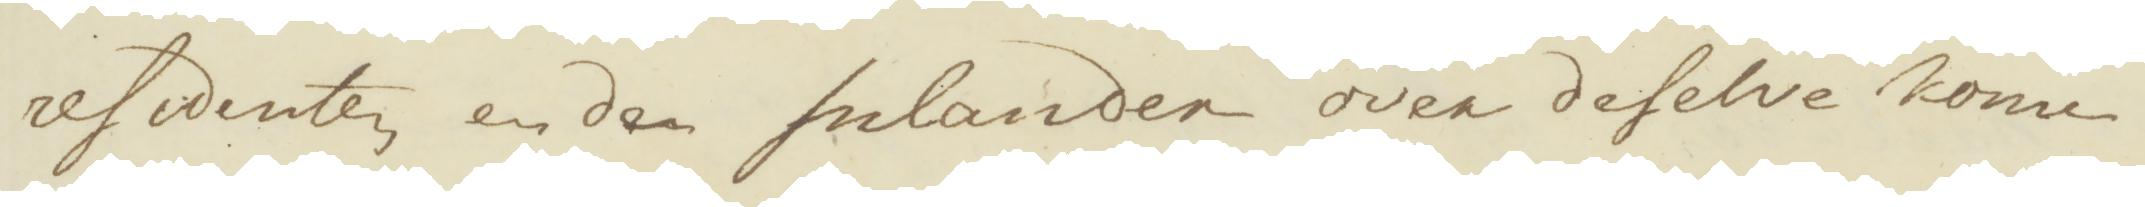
residenten en den Jnlander over deselve kome
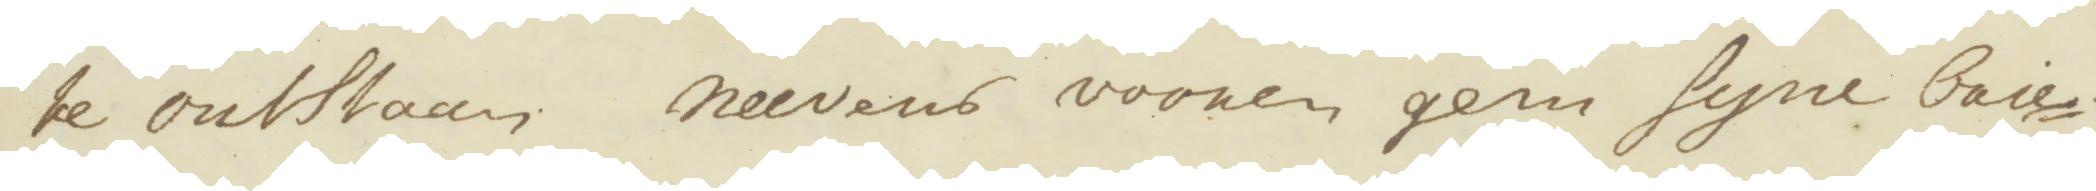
te ontstaan neevens vooren gem syne brie=
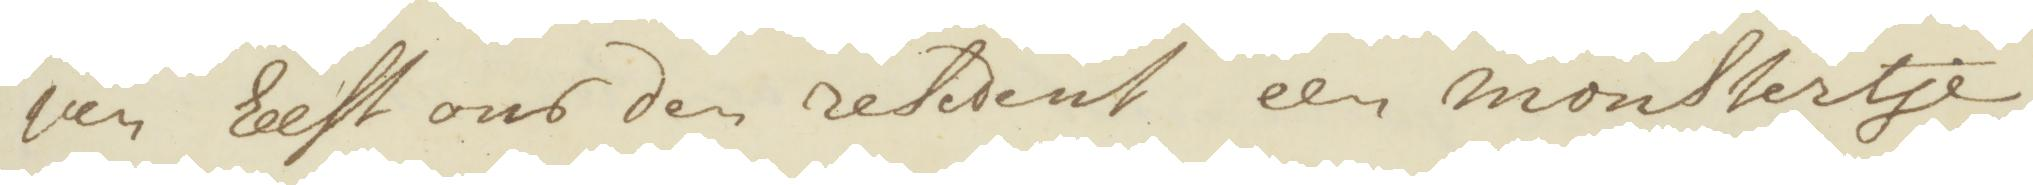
ven heeft ons den resident een monstertje
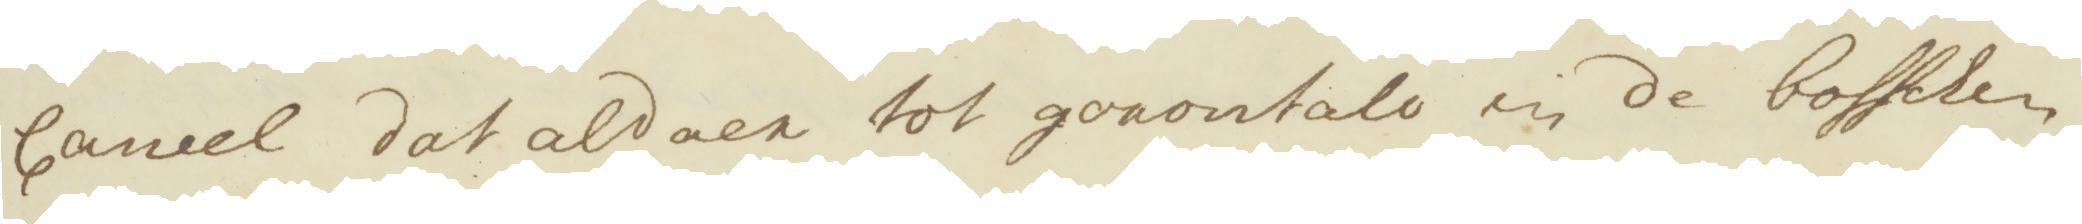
Caneel dat aldaer tot gorontalo in de bosschen
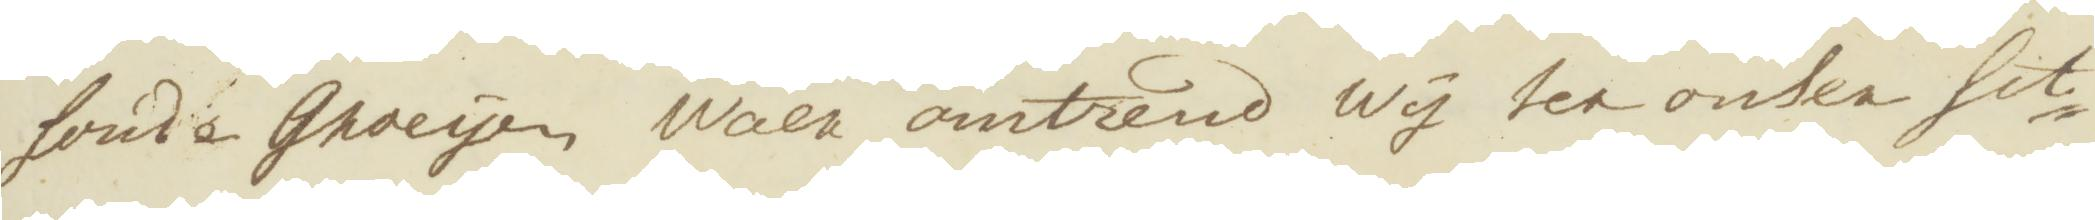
soude groeijen waer omtrend wij ter onser sit=
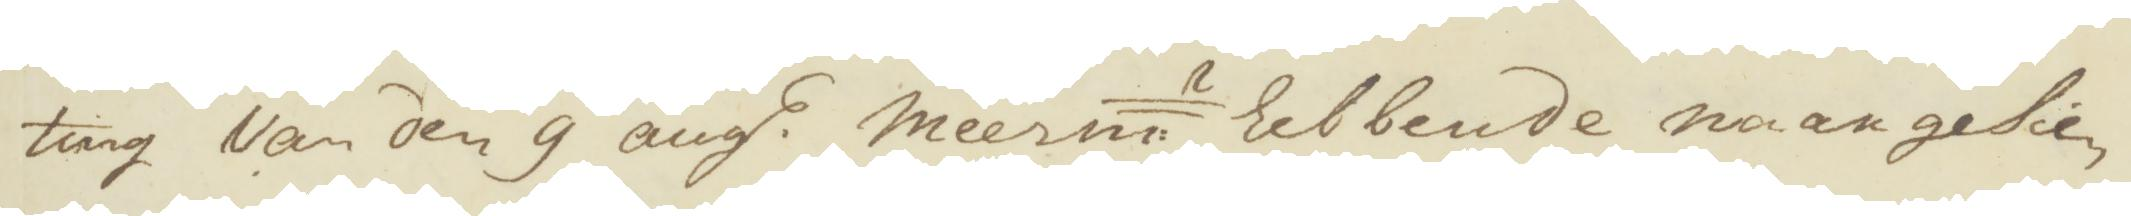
ting van den 9 aug.s meerm:=r hebbende naar gesien
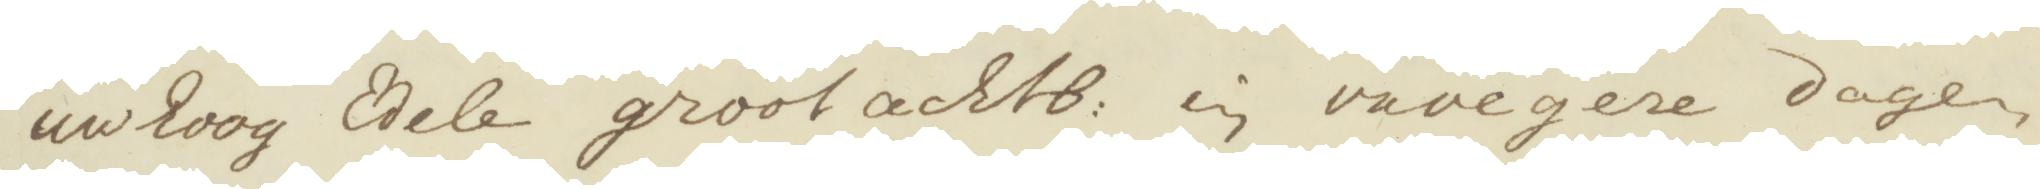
uw hoog Edele groot achtb: in vroegere dagen
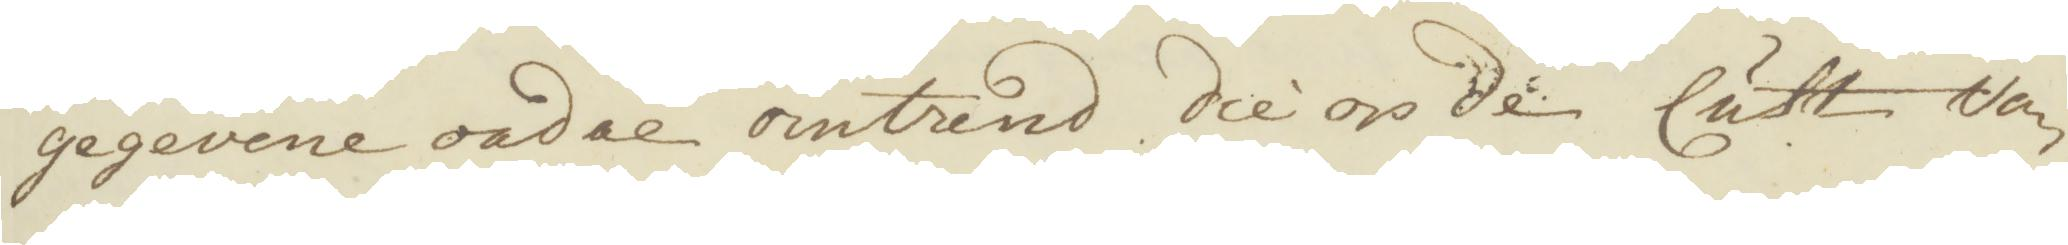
gegevene ordre omtrend die op de Cust van
